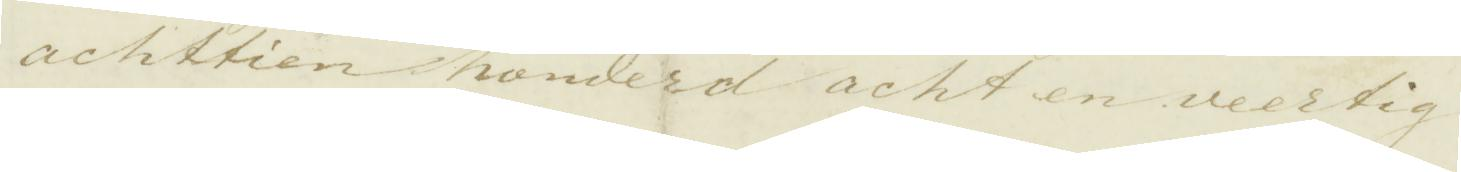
achttien honderd acht en veertig
